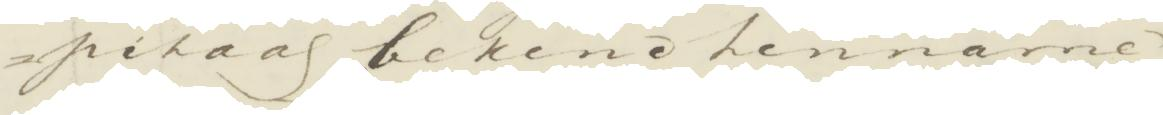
„pitaal bekend ten name
